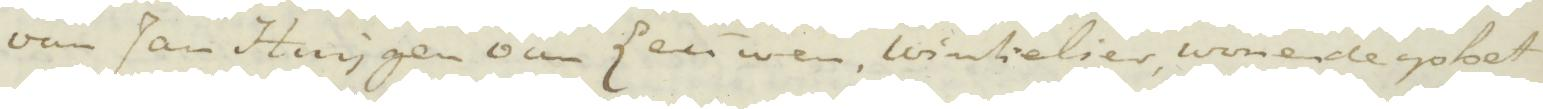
van Jan Huijgen van Leuwen, winkelier, wonende op het
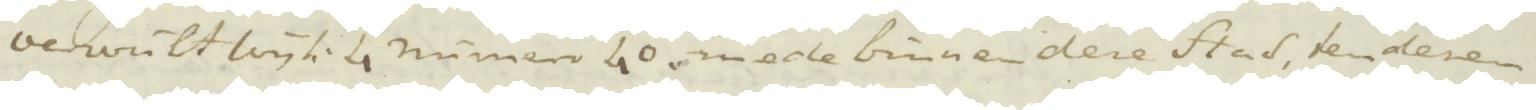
vervult Wijk 4 Numero 40, mede binnen deze stad, ten dezen
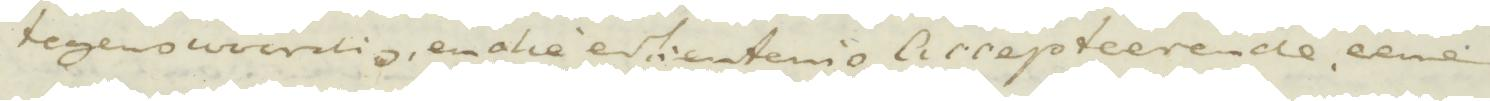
tegenswoordig, en die erkentenis Accepteerende, eene
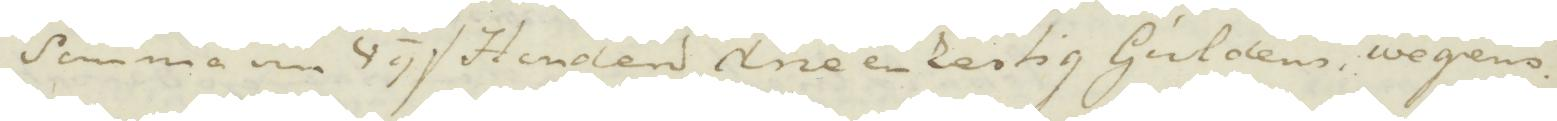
somma van Vijf Honderd drie en zestig Guldens, wegens
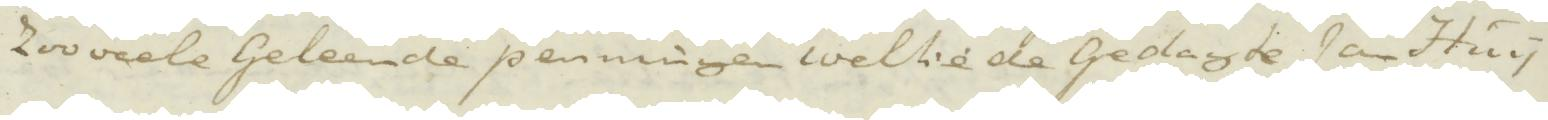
zoo veele Geleende penningen welke de Gedaagde Jan Huij
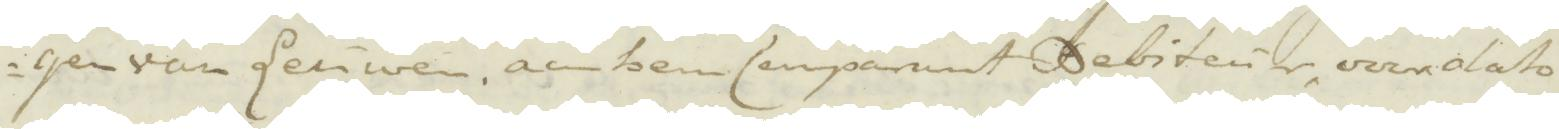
„gen van Leuwen, aan hem Comparant Debiteur, van dato
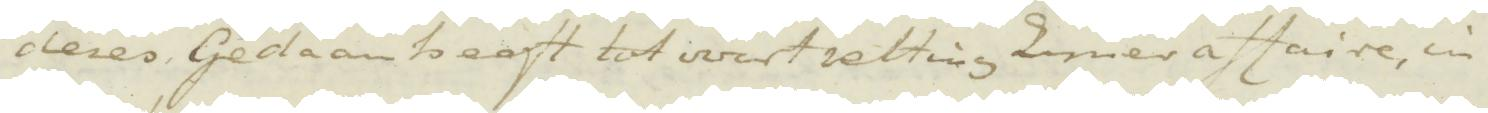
dezes, Gedaan heeft tot voortzetting Ener affaire, in
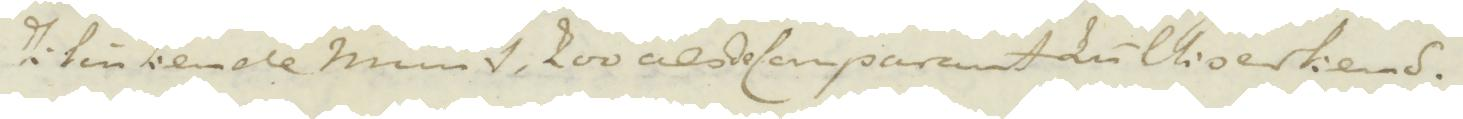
Klinkende munt, zoo als de Comparant zulks erkend.
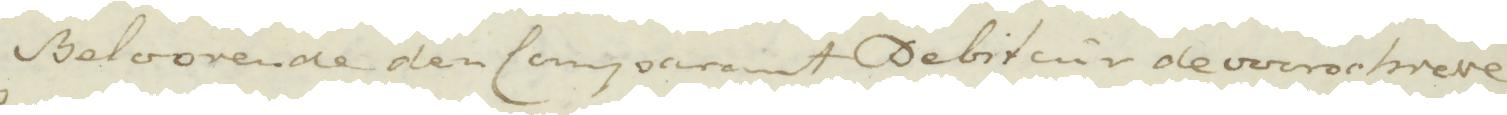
Beloovende den Comparant Debiteur de voorschreve
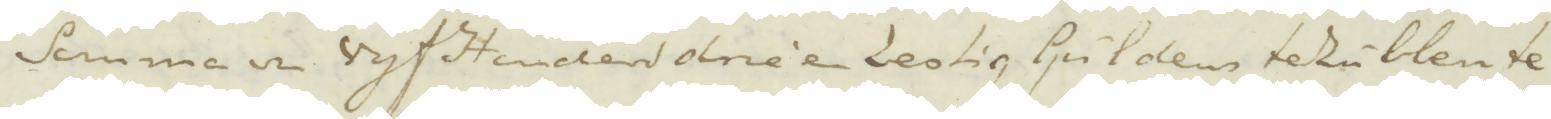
somma vijf Honderd drie en zestig Guldens, te zullen te
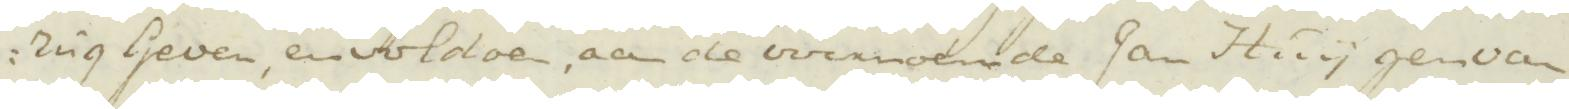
„rug Geven, en voldoen, aan de voornoemde Jan Huijgen van
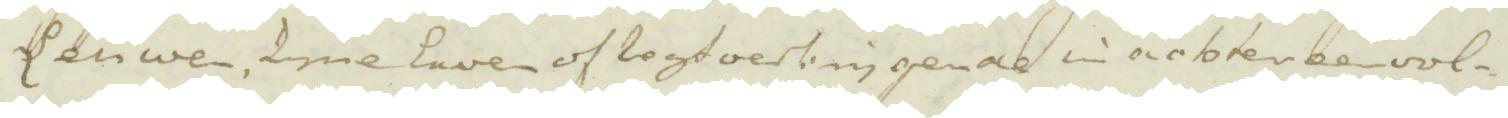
Leuwen, zijne Erven of Regtverkrijgende in achtereenvol„
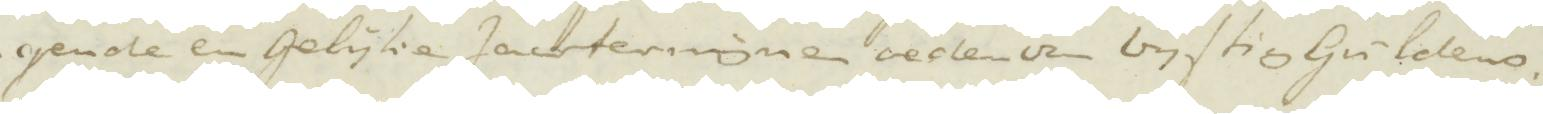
gende en gelijke Jaartermijnen ieder van vijftig Guldens
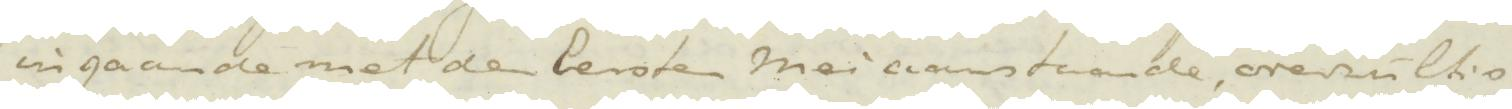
ingaande met den Eersten mei aanstaande, overzulks
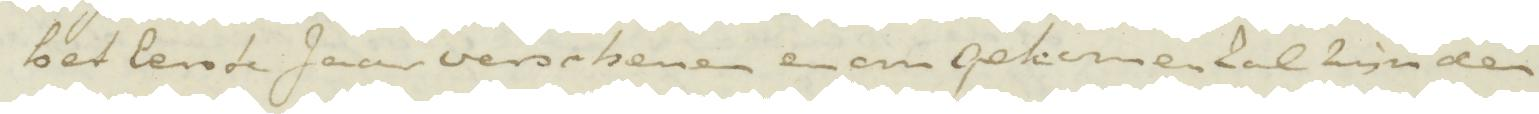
het Eerste Jaar verschenen en om gekomen zal zijn den
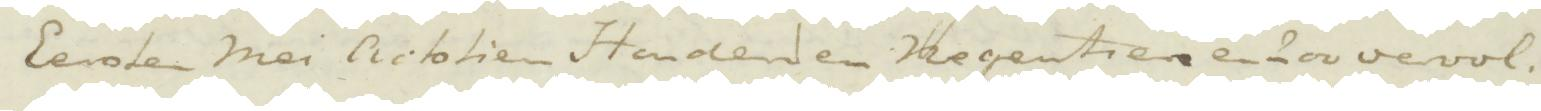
Eersten mei Achtien Honderd en Negentien en Zoo vervol,
